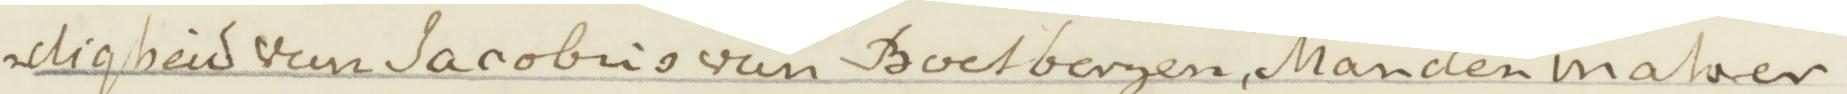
=digheid van Iacobus van Boetbergen, Manden maker
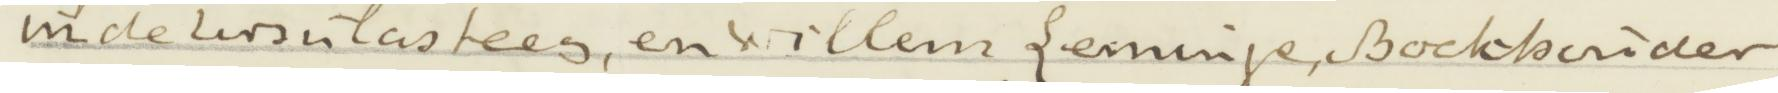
in de ursulasteeg, en illem Leminje, Boekhouder
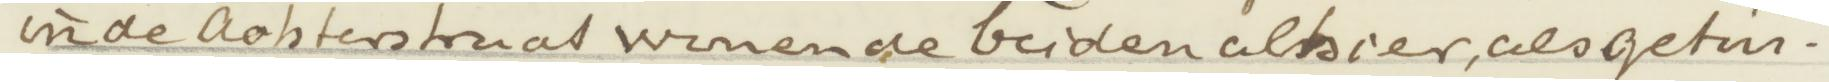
in de Achterstraat wonende beiden alhier, als getui-
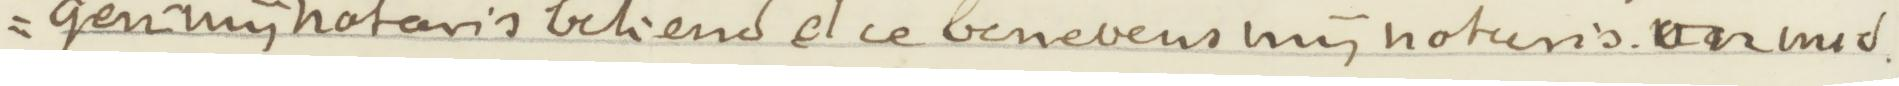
=gen mij notaris bekend die benevens mij notaris onmid.
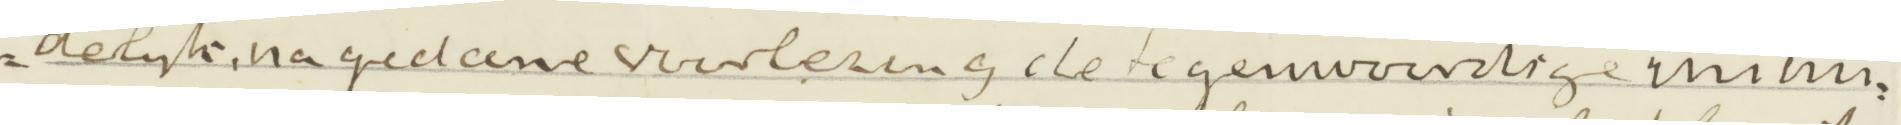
=delyk, na gedane voorlezing de tegenwoordige minu„
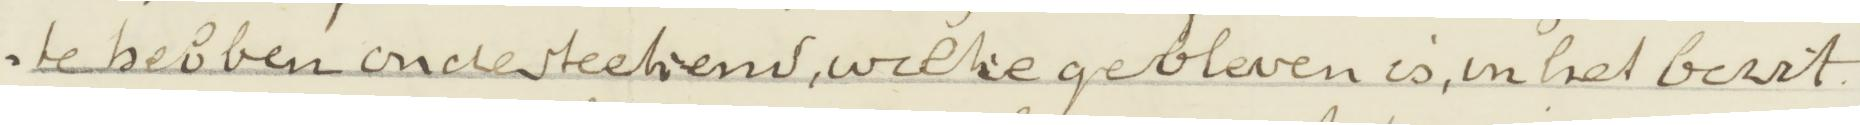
=te hebben onderteekend, welke gebleven is, in het bezit.
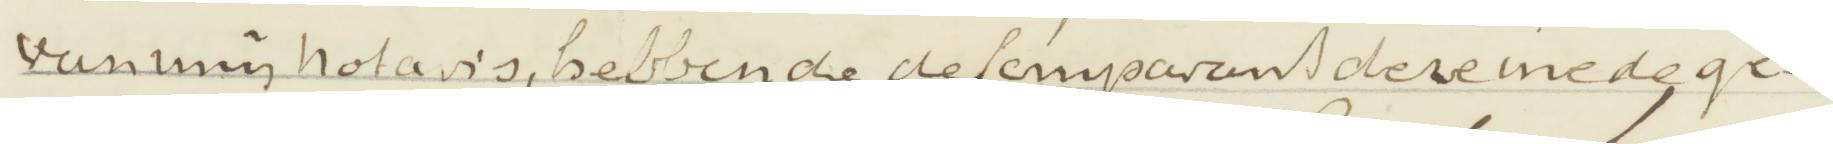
van mij Notaris, hebbende de Comparant deze mede ge=
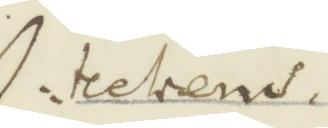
„tekend.
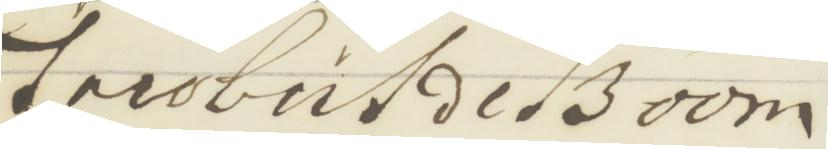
Jacobus de Boom
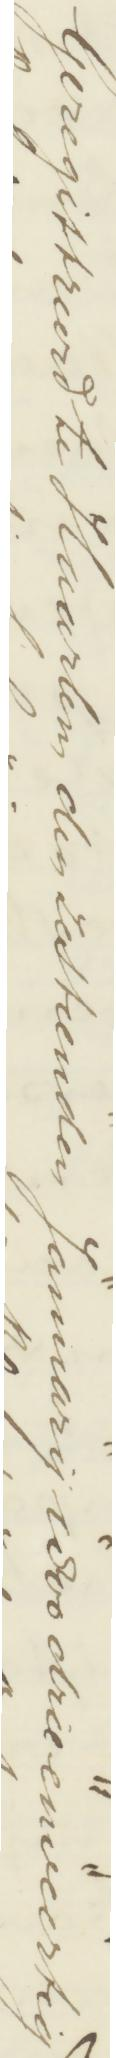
Geregistreerd te Haarlem den zestienden Januarij 1800 drie en veertig
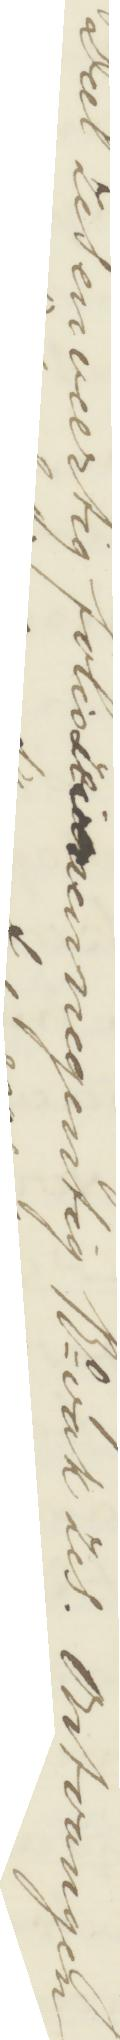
Deel zes en veertig folio zeven en negentig R=o vak zes. Ontvangen
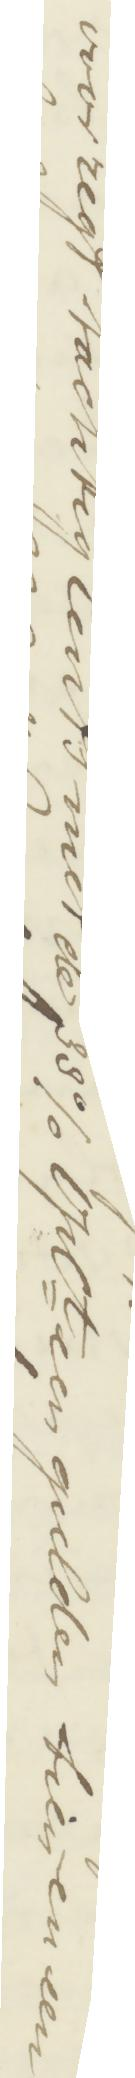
voor regt tachtig cents met de 38% Opc=t een gulden tien en een
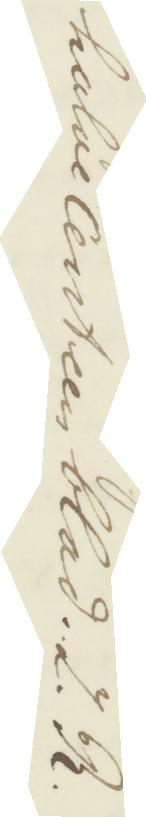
halve Cent een blad. Z. R.
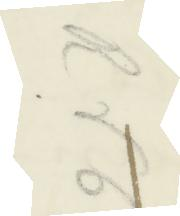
97 R V6
